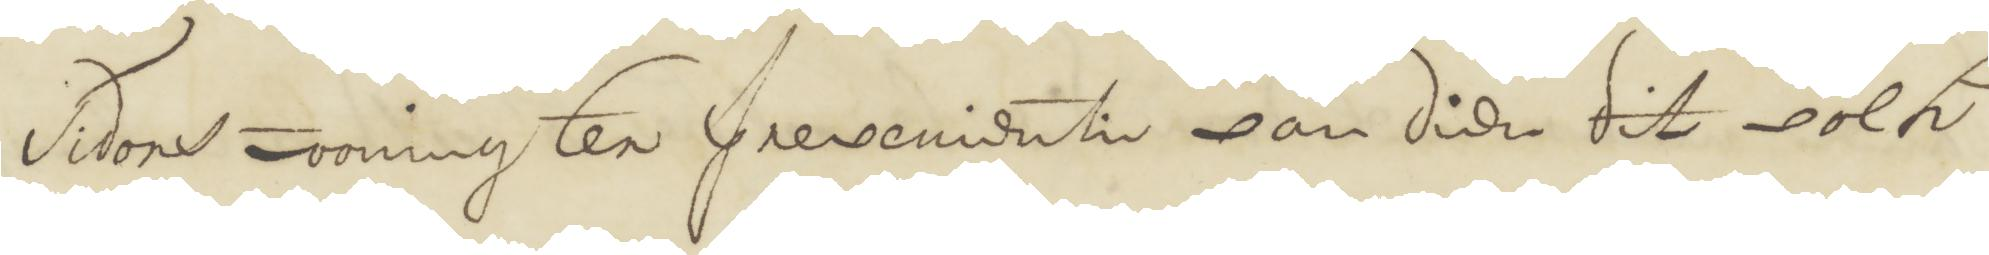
Tidors cooning ter prevenientie van dien dit volk
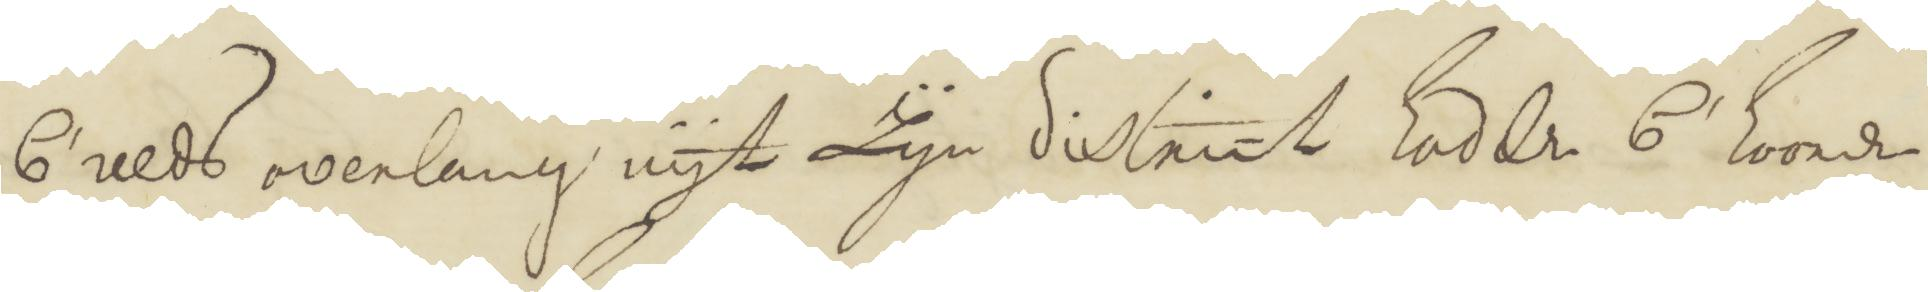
b'reeds overlang uijt zijn district hadden b'hooren
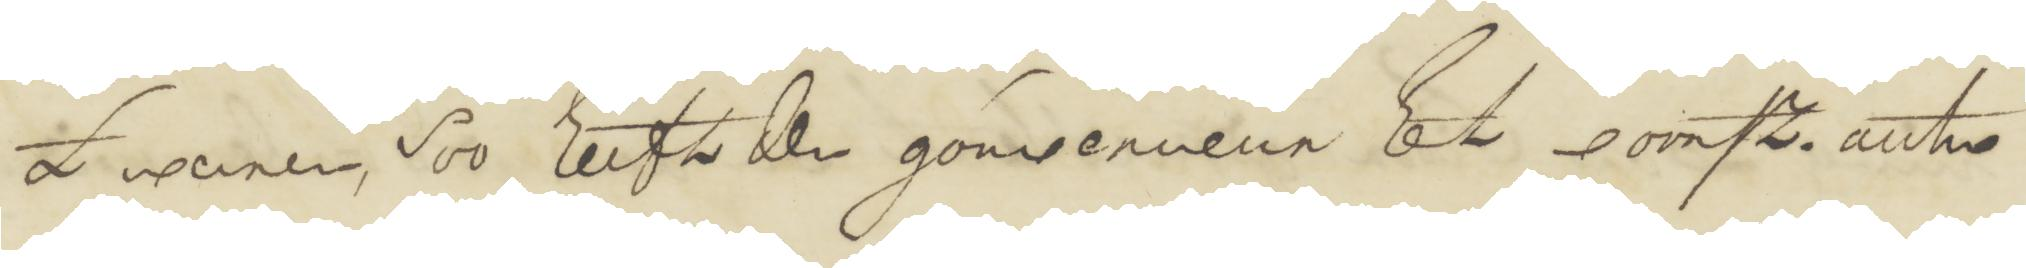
t weeren, soo heeft den gouverneur het voorsz. antw
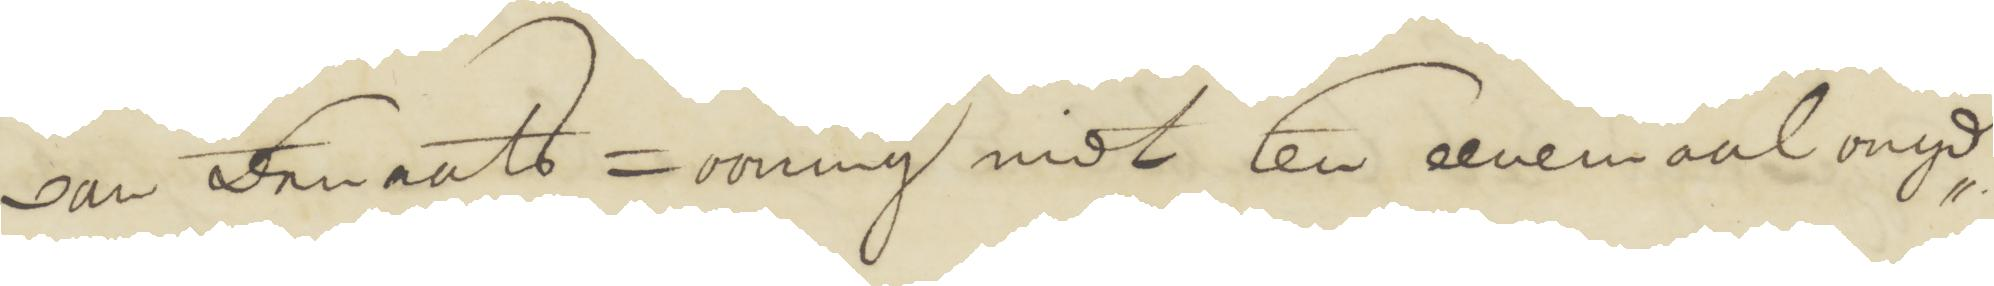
van ternaats cooning niet ten eenemaal onge„
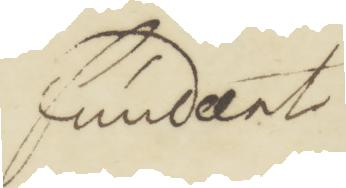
fundeert
